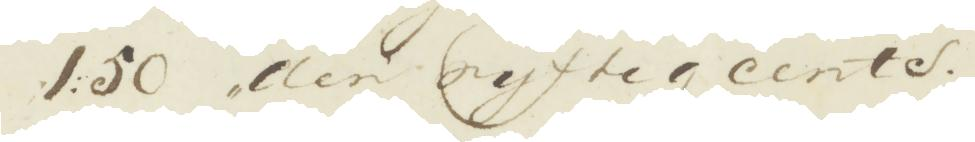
1: 50 „den vyftig cents.
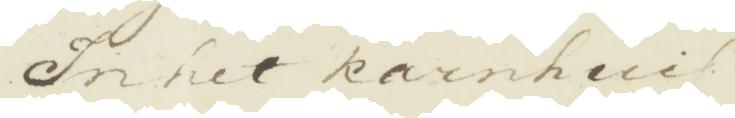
In het karnhuis.
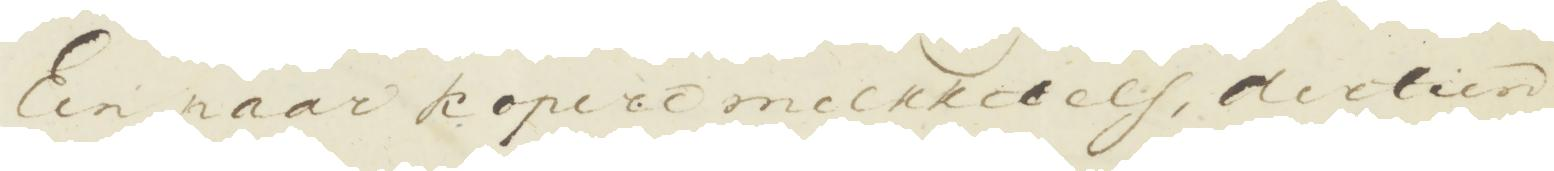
Een paar kopere melkketels, dertien
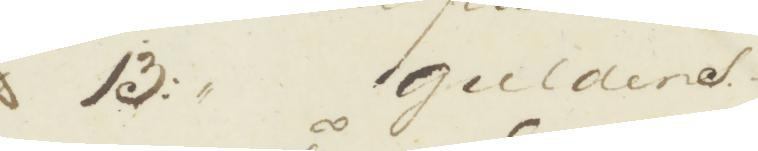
13:. „ guldens.
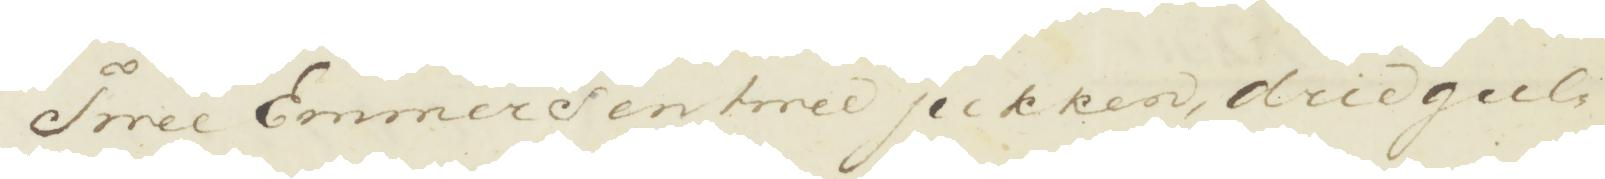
Twee Emmers en twee jukken, drie gul„
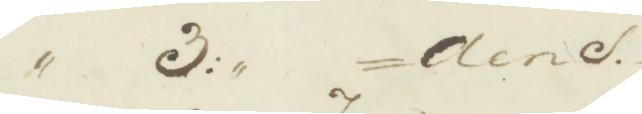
„ 3: „ =dens.
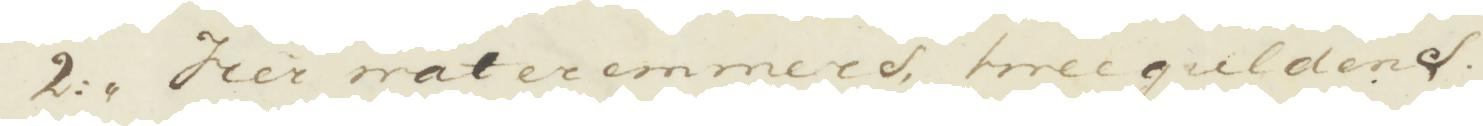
2: „ Vier wateremmers, twee guldens.
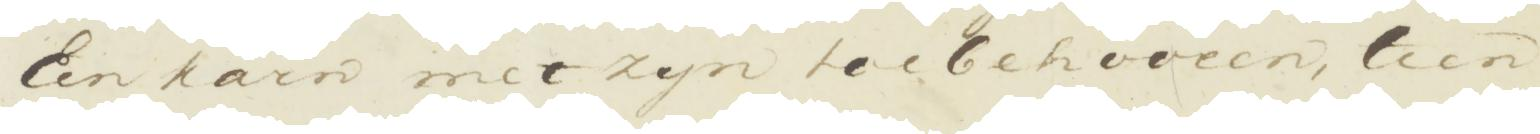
Een karn met zyn toebehooren, tien
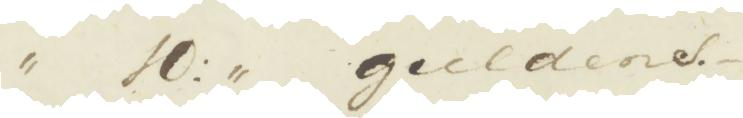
„ 10: „ guldens. —
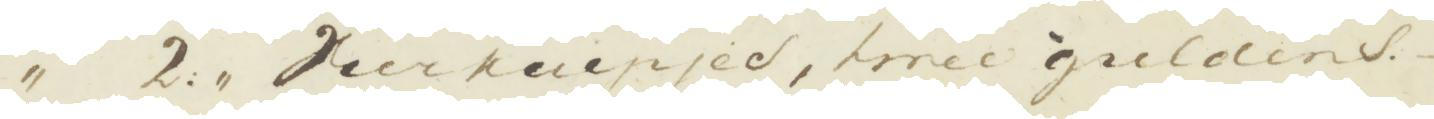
„ 2: „ Vier kuipjes, twee guldens. —
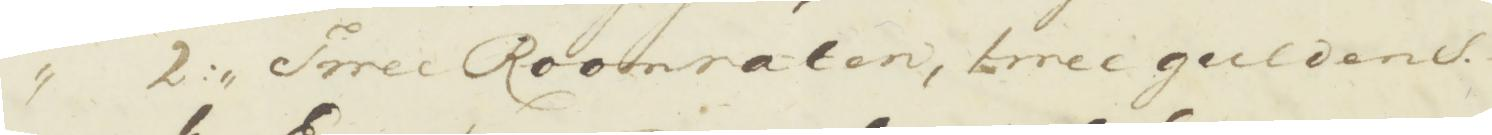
„ 2: „ Twee Roomvaten, twee guldens.
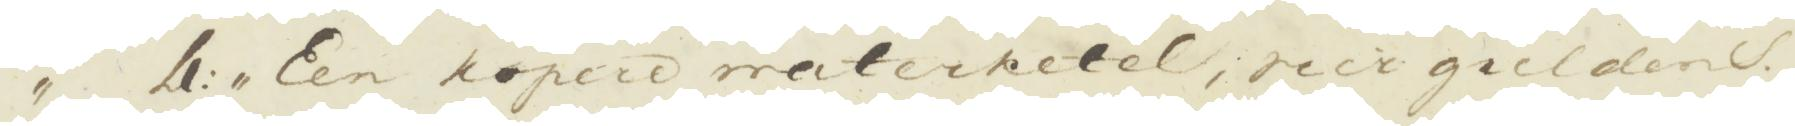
„ 4: „ Een kopere waterketel, vier guldens.
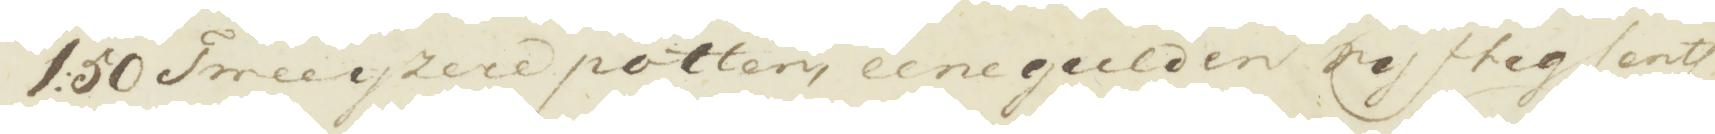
1: 50 Twee yzere potten, eene gulden vyftig Cents
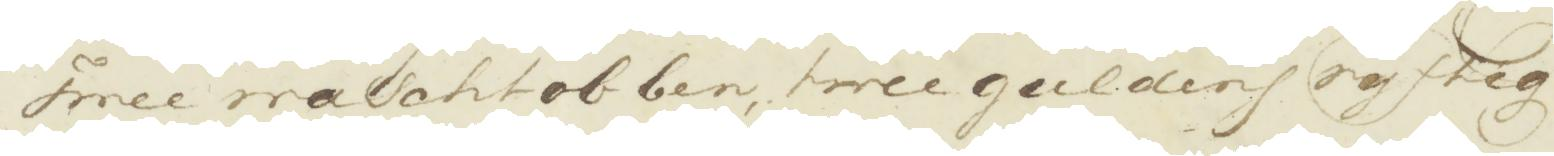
Twee waschtobben, twee guldens vyftig
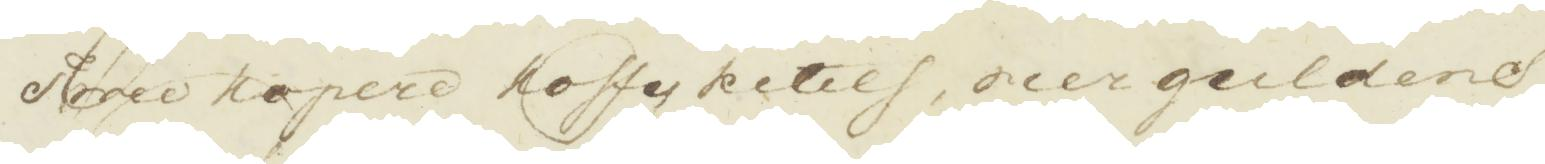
Twee kopere koffyketels, vier guldens
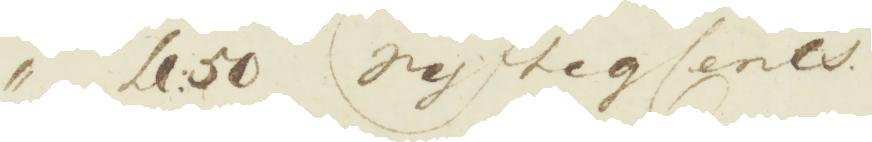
„ 4: 50 Vijftig Cents.
